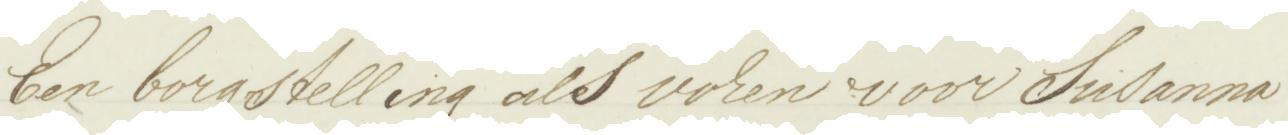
Een borgstelling als voren voor Susanna
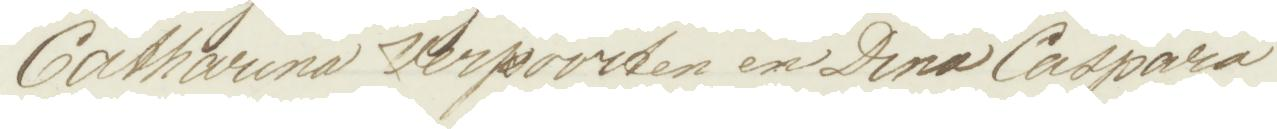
Catharina Verpoorten en Dina Caspara
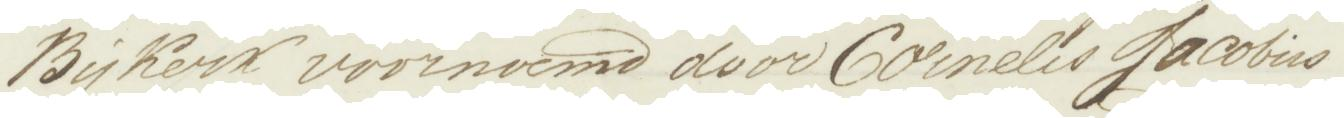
Bijkerk voornoemd door Cornelis Jacobus
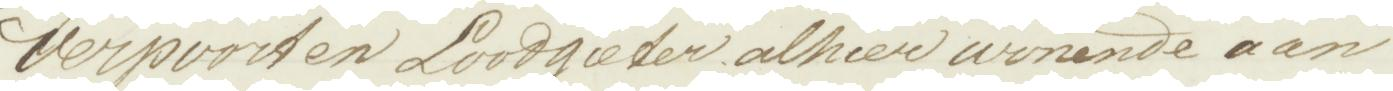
verpoorten Loodgieter alhier wonende aan
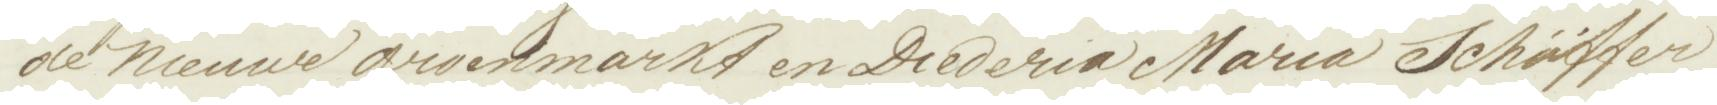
de nieuwe groenmarkt en Diederia Maria Schäffer
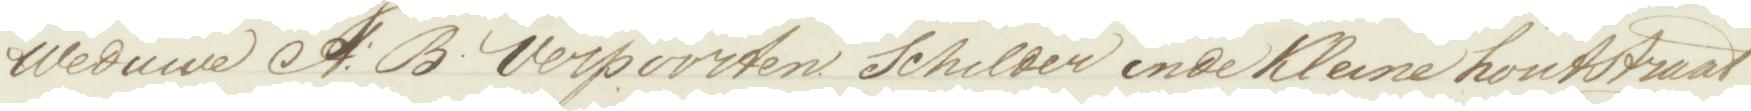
Weduwe A: B: Verpoorten Schilder inde Kleine houtstraat
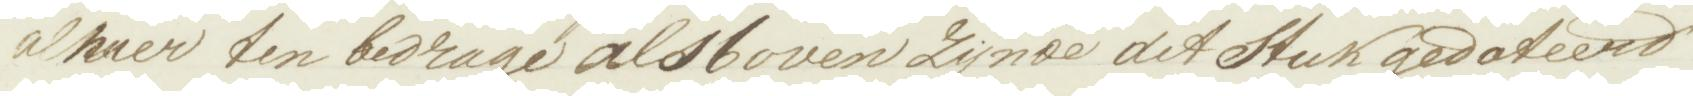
alhier ten bedrage als boven zijnde dit stuk gedateerd
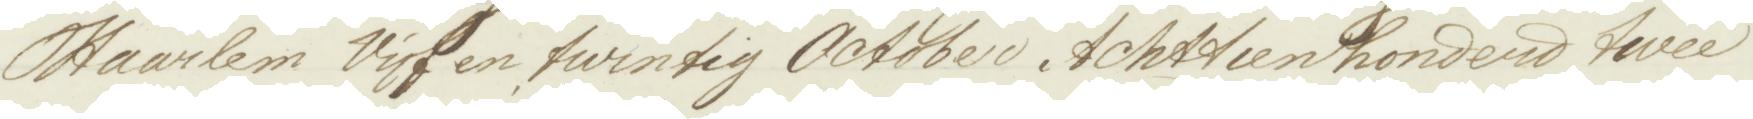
Haarlem Vijf en twintig October Achttien honderd twee
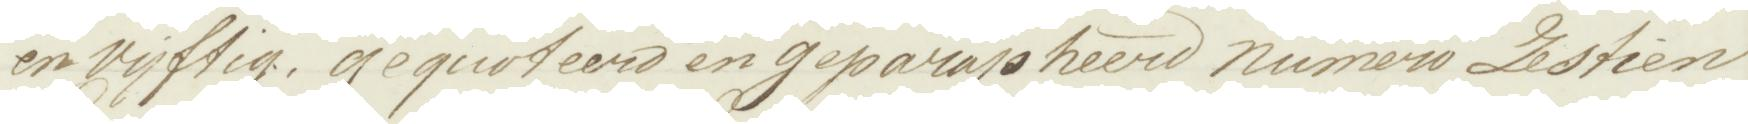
en vijftig, gequoteerd en geparapheerd numero zestien
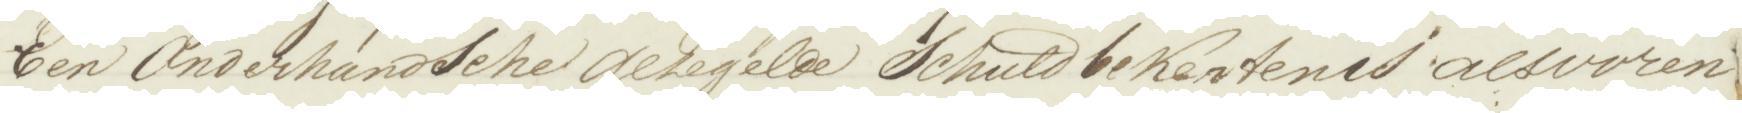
Een Onderhandsche gezegelde schuld bekentenis als voren
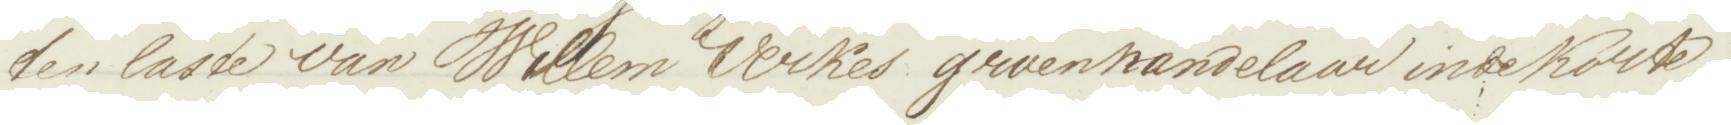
ten laste van Willem Verkes, groenhandelaar in de Korte
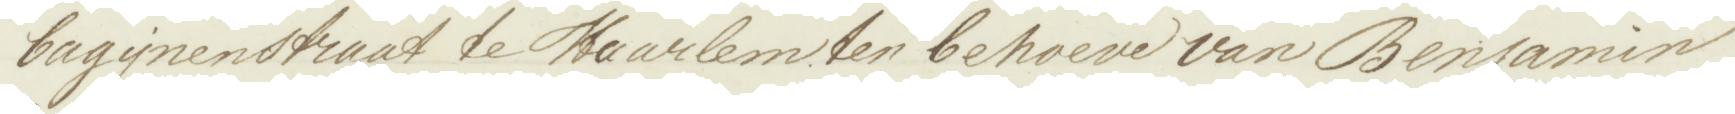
bagijnenstraat te Haarlem en behoeve van Benjamin
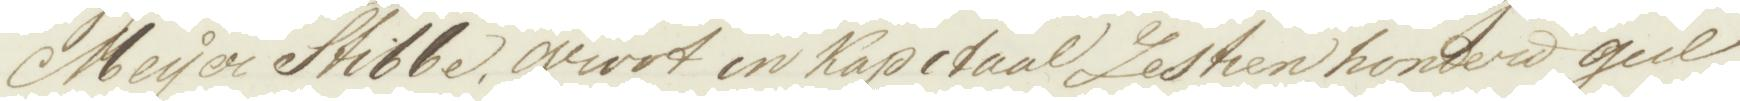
Meijer Stibbe, groot in Kapitaal Zestien honderd gul
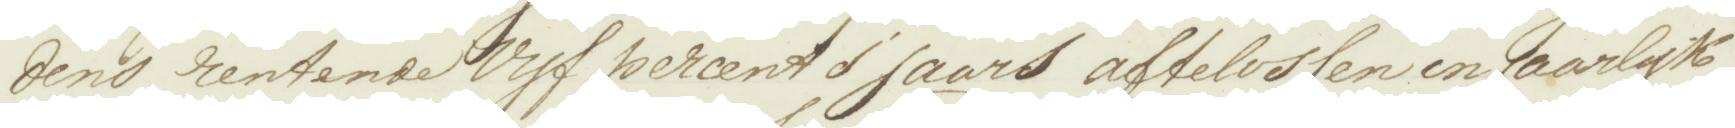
dens rentende Vyf percent s' Jaars aftelossen in jaarlijk
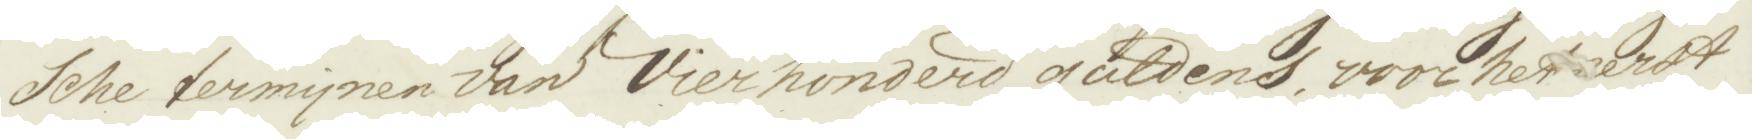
sche termijnen van Vier honderd guldens, voor het eerst
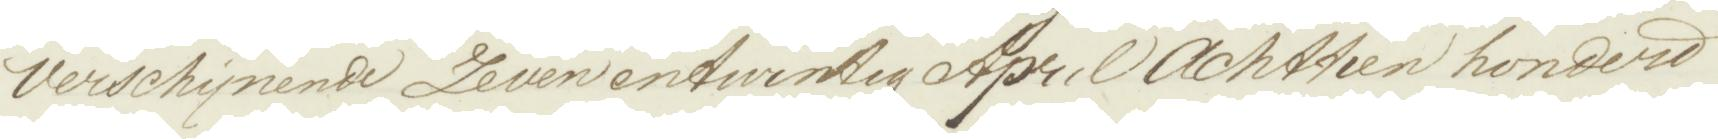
verschijnende Zeven en twintig April Achttien honderd
